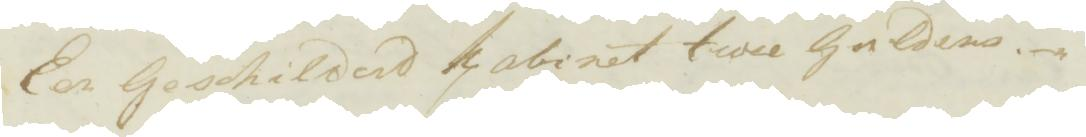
Een Geschilderd kabinet twee Guldens. —„
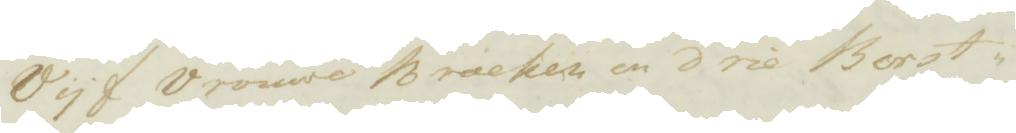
Vijf Vrouwe Broeken en drie Borst„
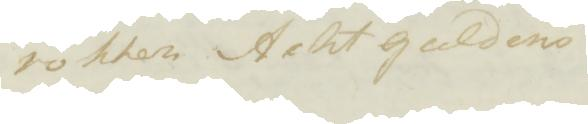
rokken Acht guldens
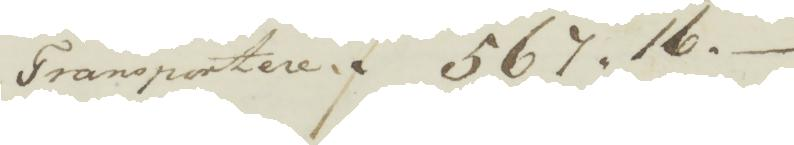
Transportere ƒ 567„ 16„ —
